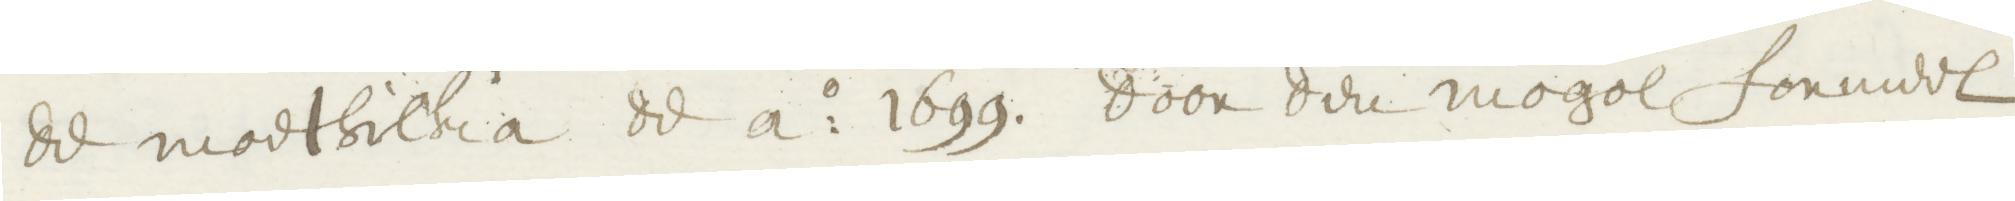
de moetsilka de a:o 1699. door den mogol formeel
